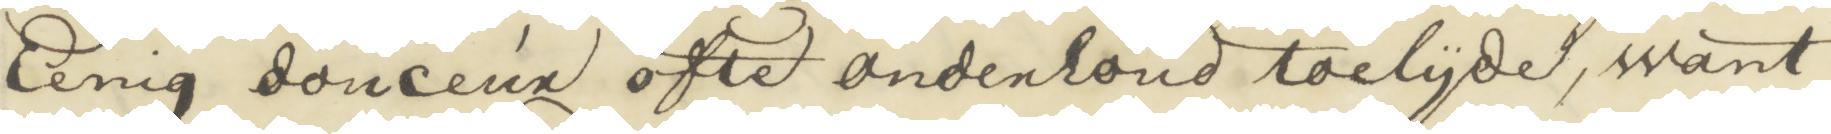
Eenig douceur ofte onderhoud toelijde, want
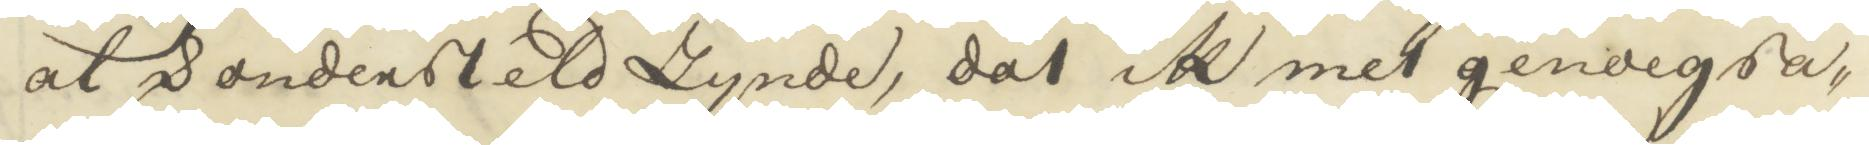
al verondersteld zynde, dat ik met genoegsa„
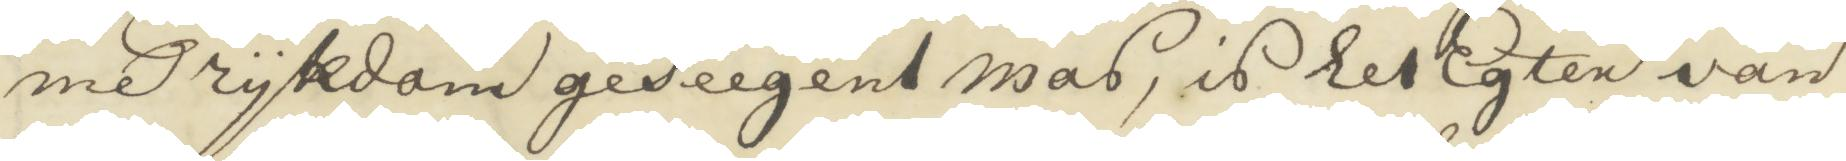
me rijkdom geseegent was, is het Egter van
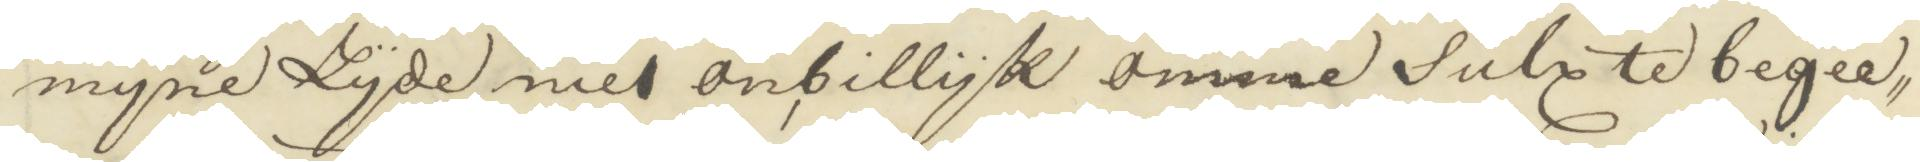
mijne zijde niet onbillijk omme sulx te begee„
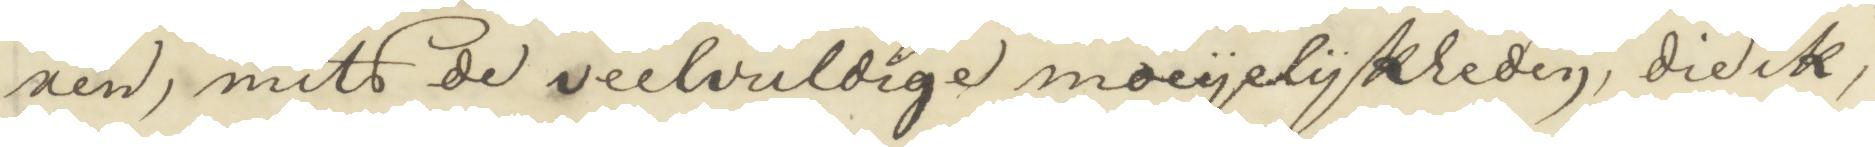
ren, mits de veelvuldige moeijelijkheden, die ik,
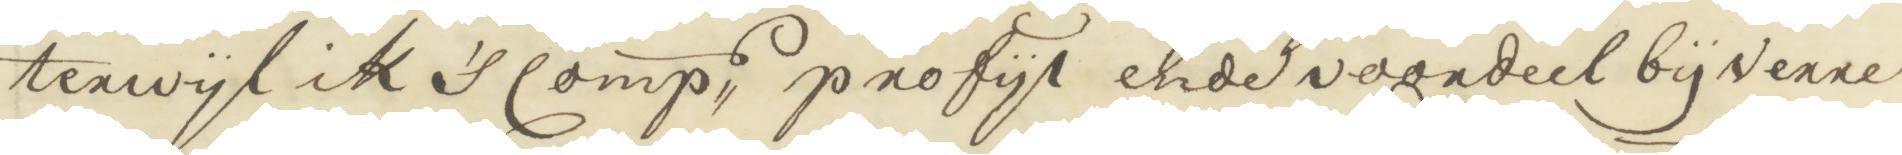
terwijl ik ’s Comp„s profijt ende voordeel bij verre
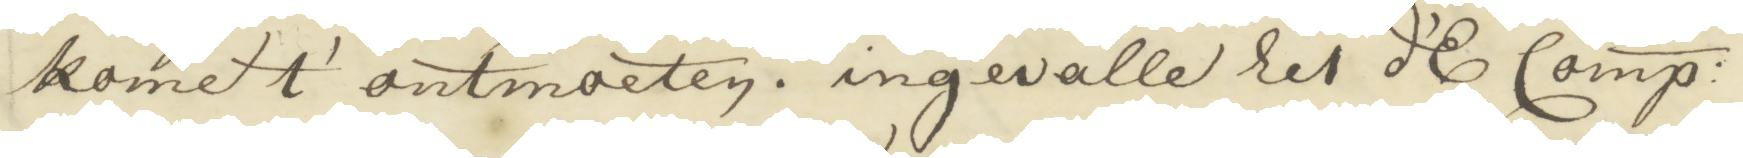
kome t' ontmoeten. ingevalle het d'E Comp:
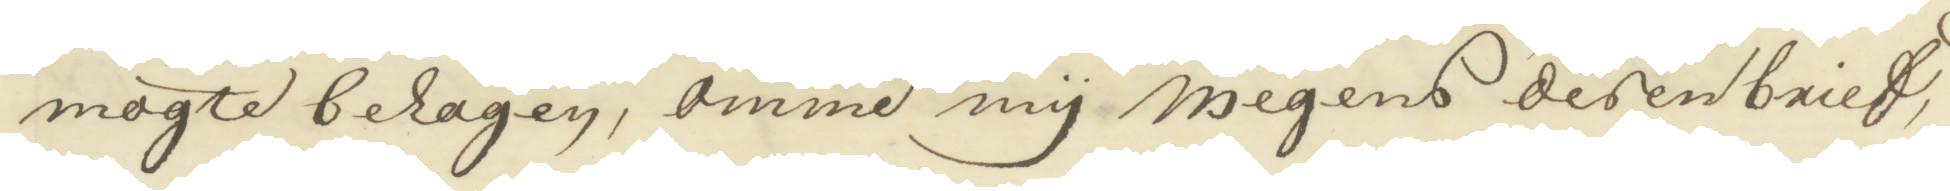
mogte behagen, omme mij wegens desen brief,
